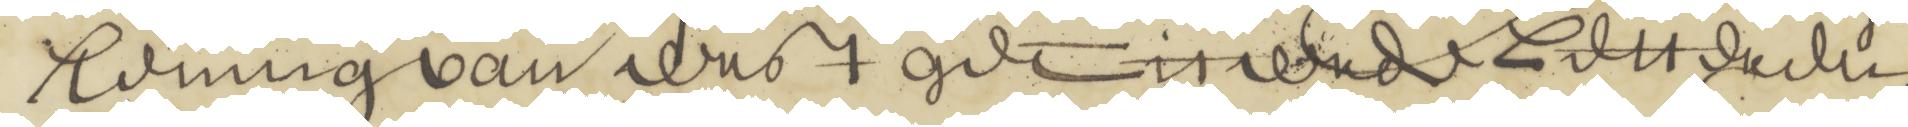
kening van eerst geciteerde letteren
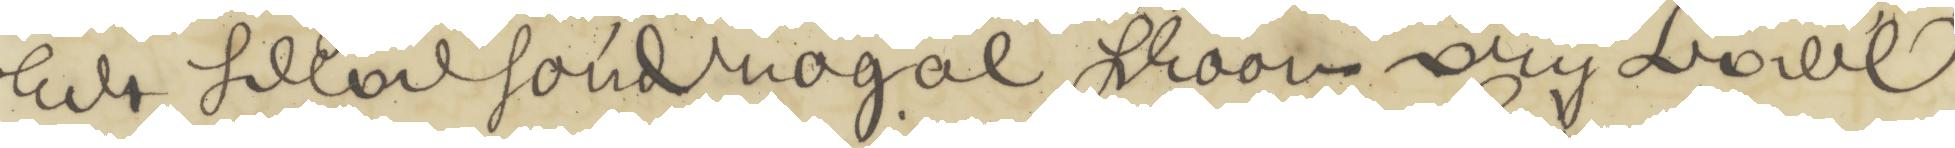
het selve soude nogal schoon vrij teveel
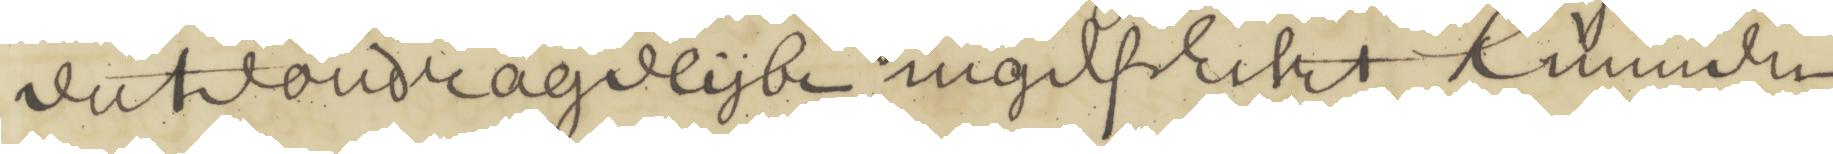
en te ondragelijk ingeschikt kunnen
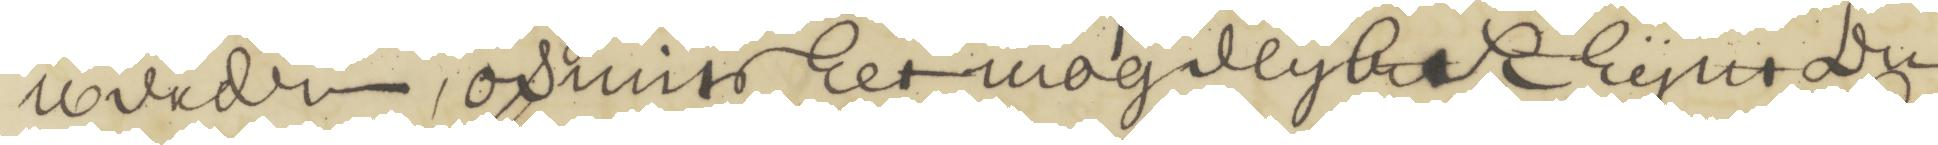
werden, overmits het mogelijk Schijnt ten
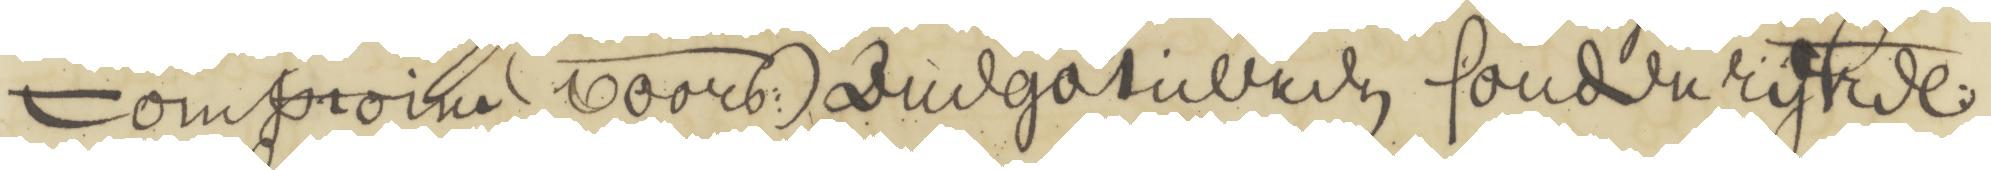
Comptoire (voors:) te negotieeren sonder rijkel:
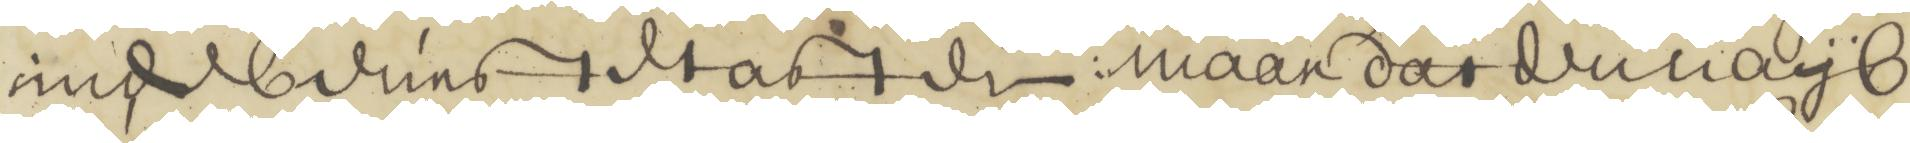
in de beurs tetasten: maar dat den naijb
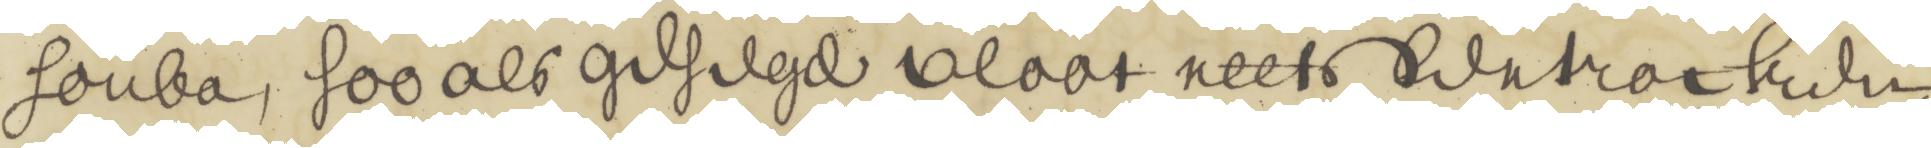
souba, soo als gesegde vloot reets vertrocken
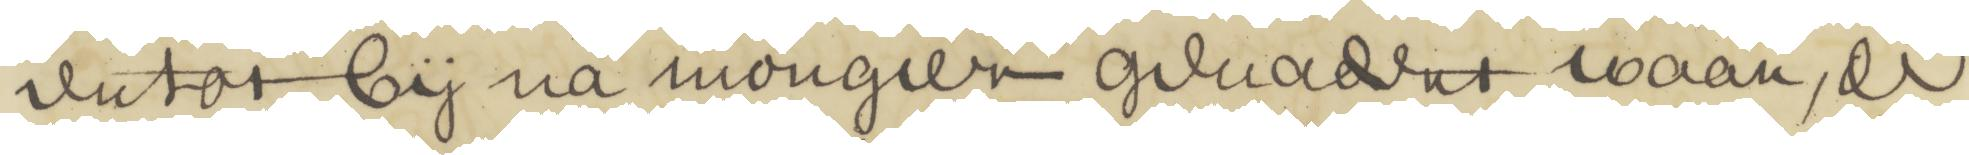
en tot bij na mongier genadert waar, de
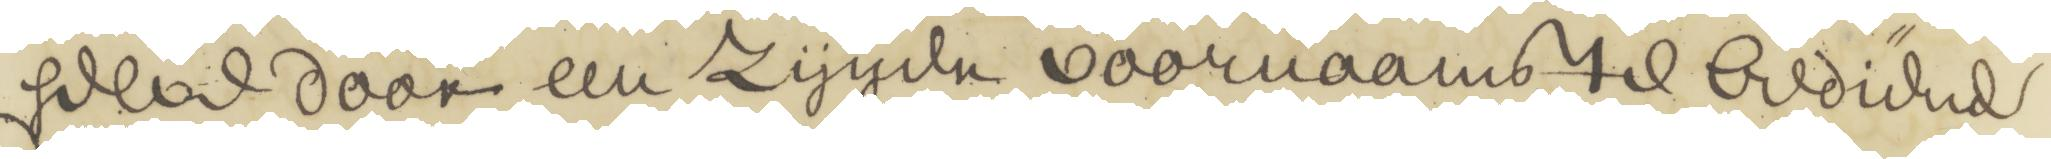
selve door een zijner voornaamste bediende
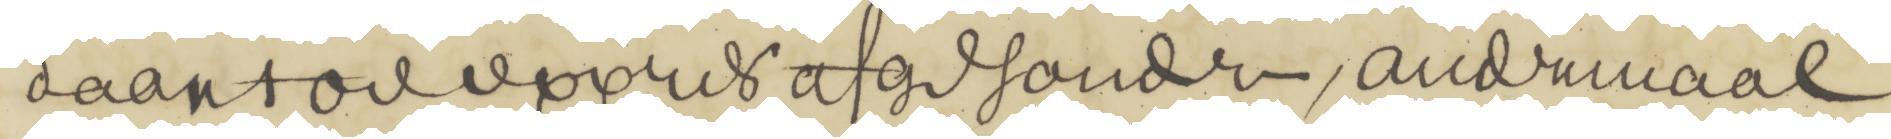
daartoe expres afgesonden, andermaal
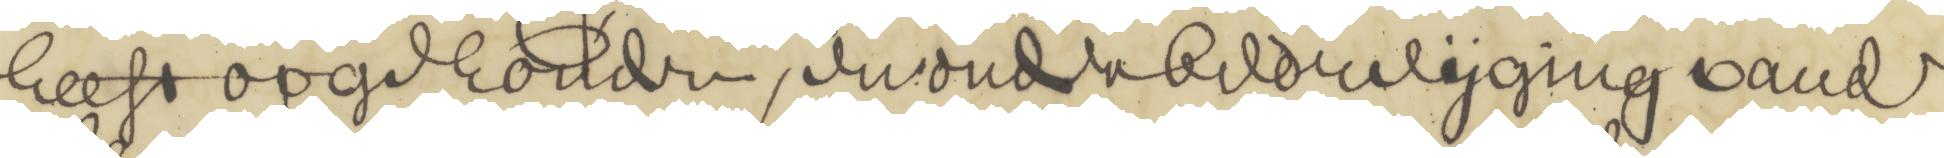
heeft opgehouden, en onder bedreijging vande
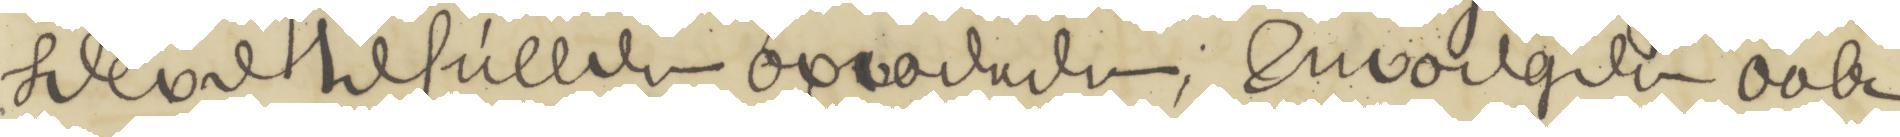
selve tesullen opvoeren; Invoegen ook
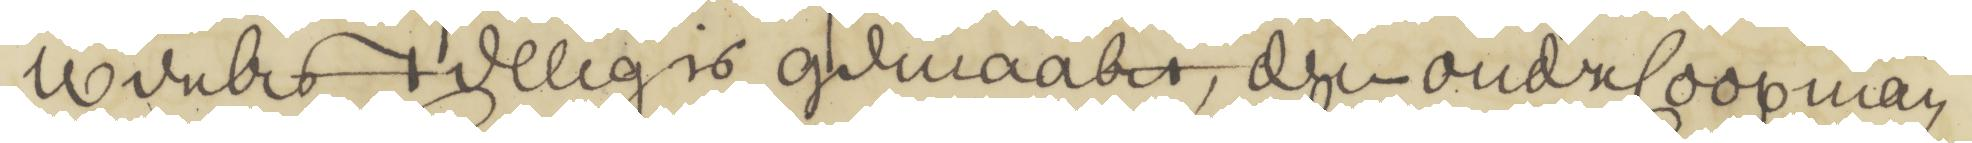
werkstellig is gemaakt, den ondercoopman
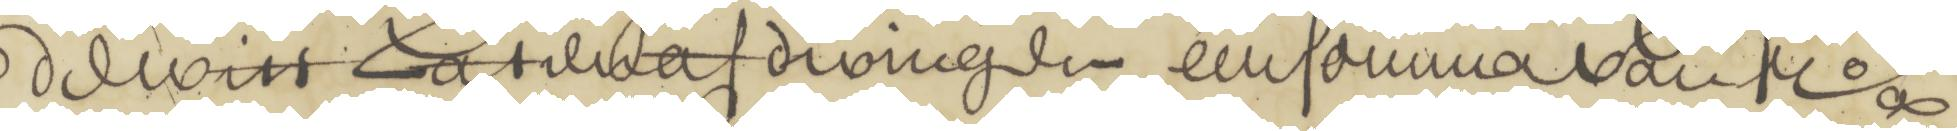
de witt Laten afdwingen een somma van ro/a
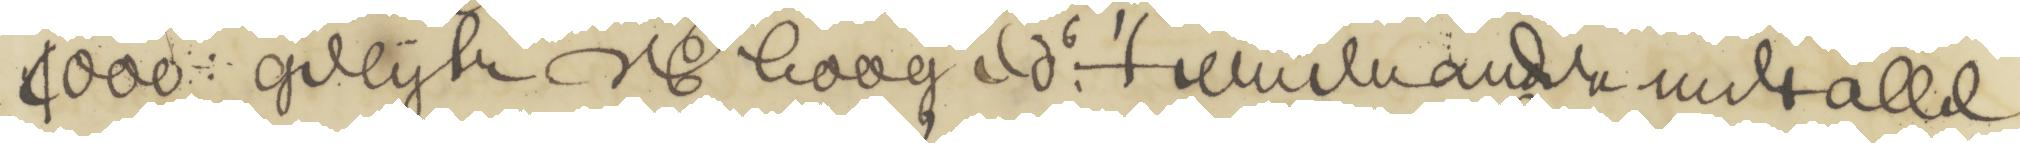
4000: gelijk vE hoog Ed:s 't eenenander met alle
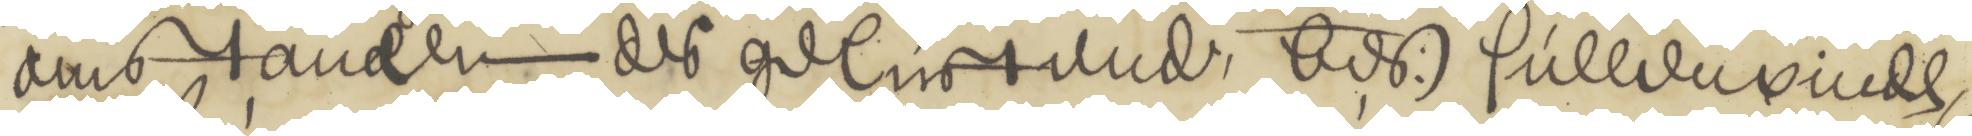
omstanden des gecustende, bes: sullen vinden
